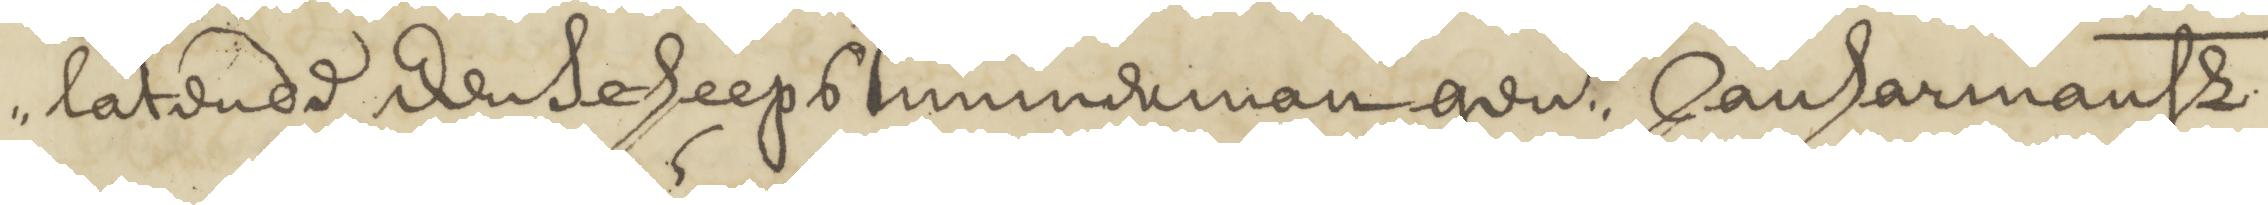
„latende Een scheepstimmerman gen:t Jan Harmansz:
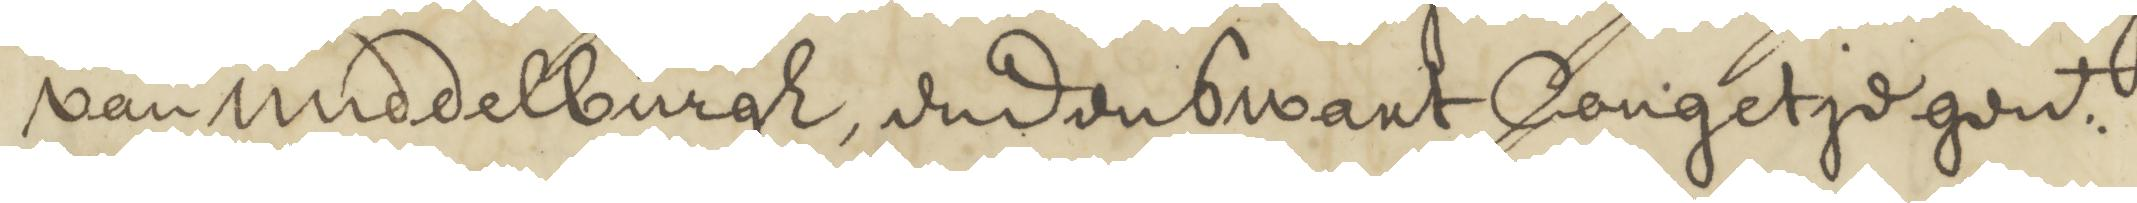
van middelburgh, en Een swart Jongetje gen„t
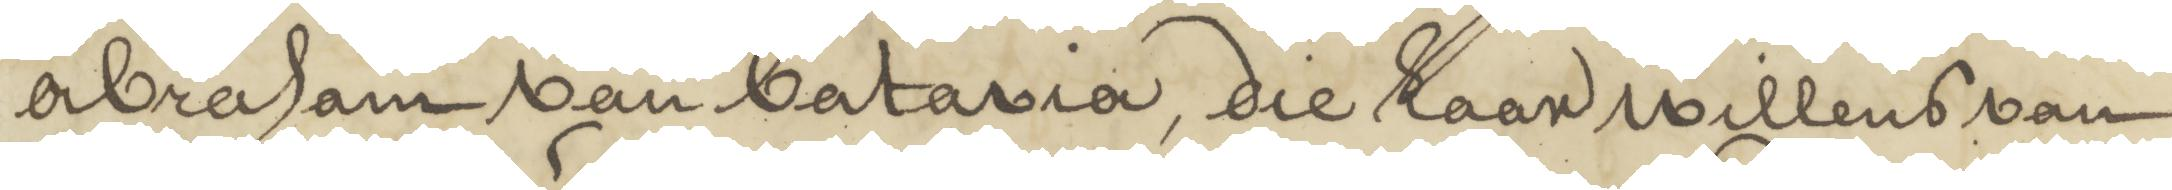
abraham van batavia, die haar willens van
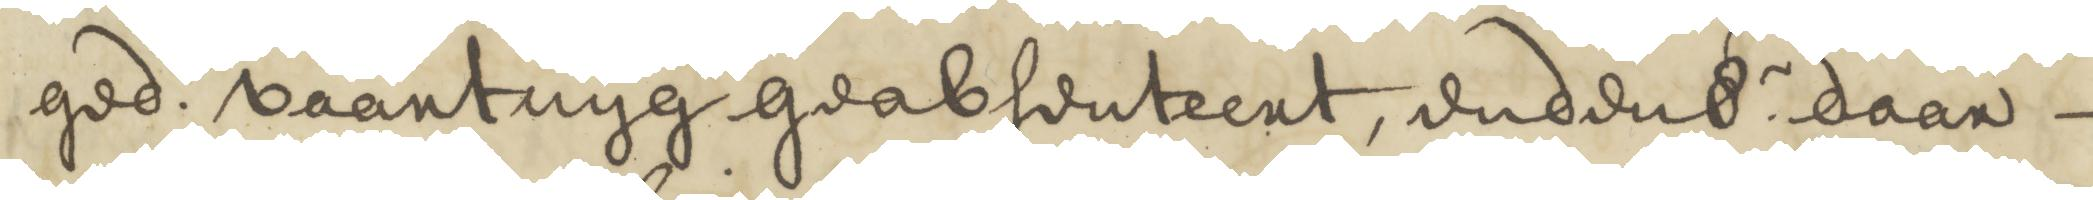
ged. vaartuijg geabsenteert, en den 8.' daar
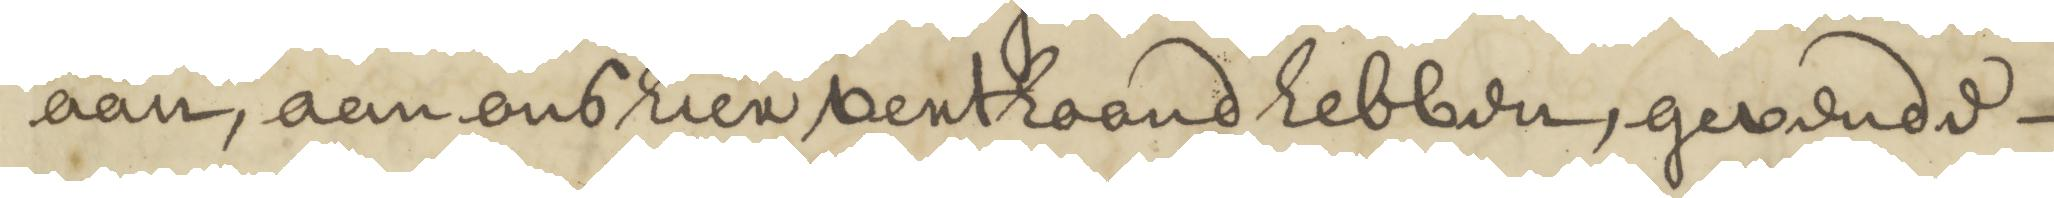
aan, aan ons hier verthoond hebben, gevende
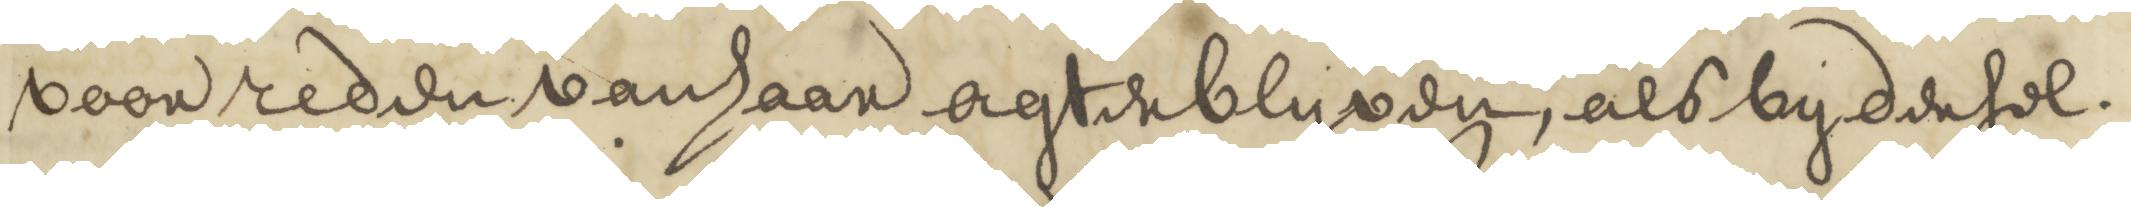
voor reden van haar agterblijven, als bij dersel.
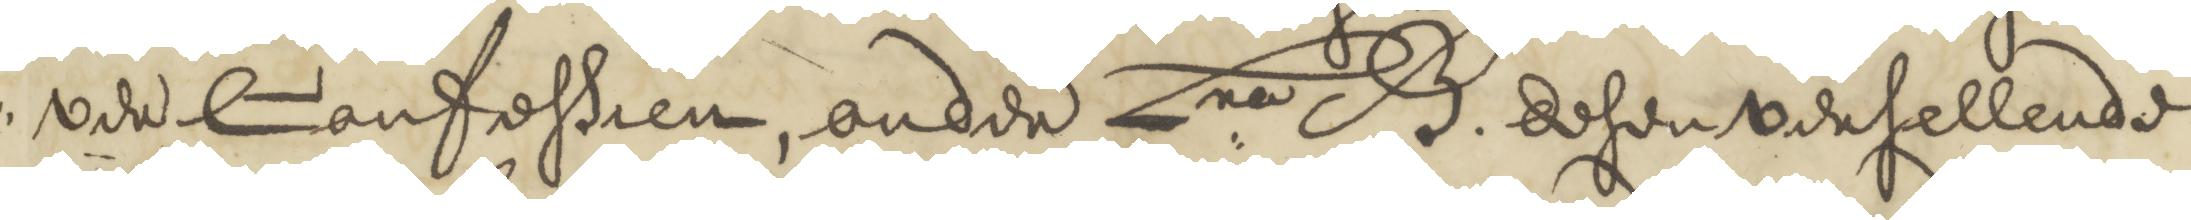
„ver Confessien, onder L„ra B. desen versellende
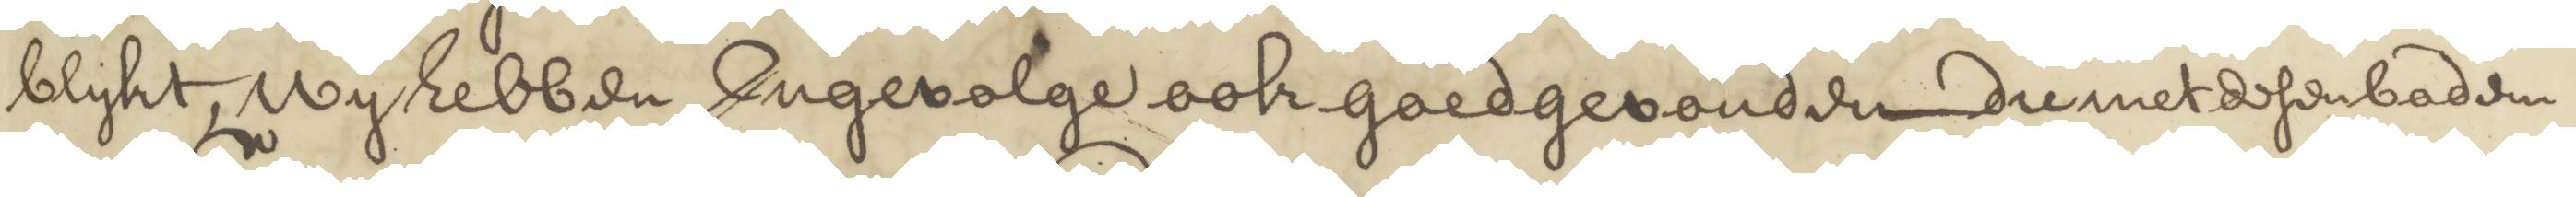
blijkt, wij hebben Jngevolge ook goedgevonden die met desen bodem
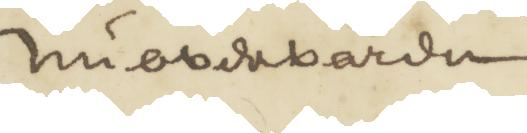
nu overvaren
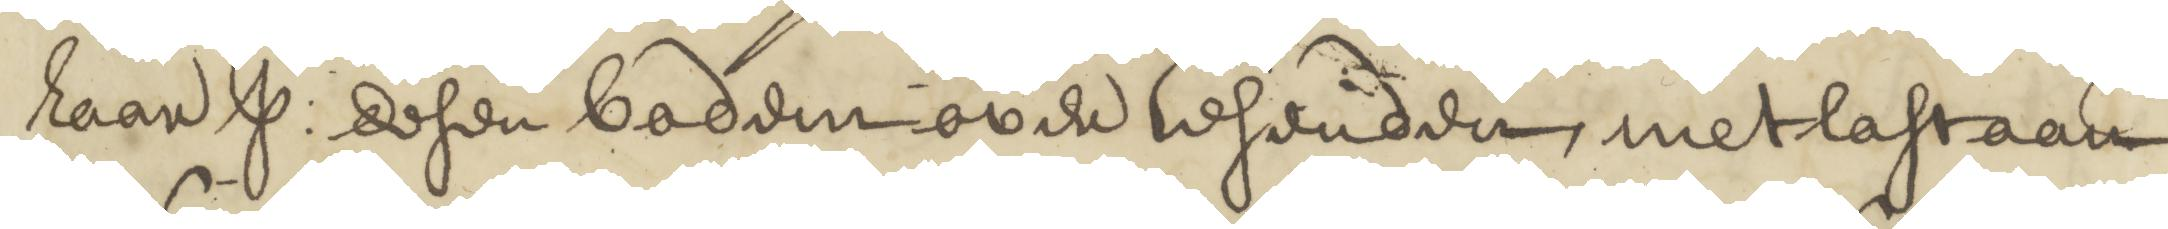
haar p:r desen bodem over tesenden, met last aan
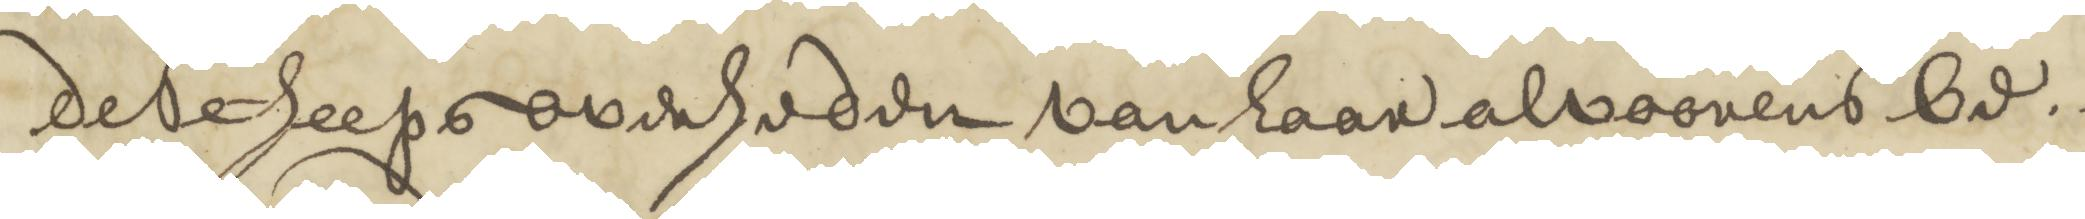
de scheepsoverheden van haar alvoorens be.
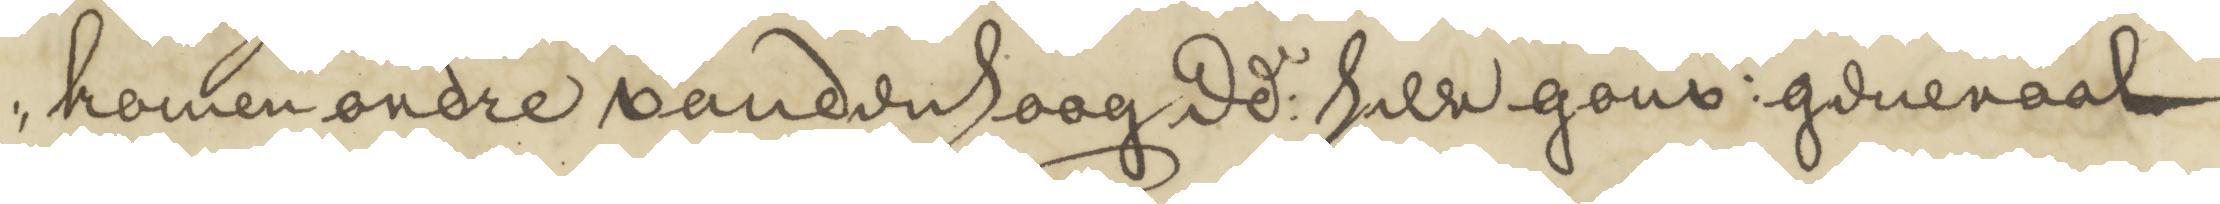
„komen ordre van den hoog Ed: heer gouv:r generaal
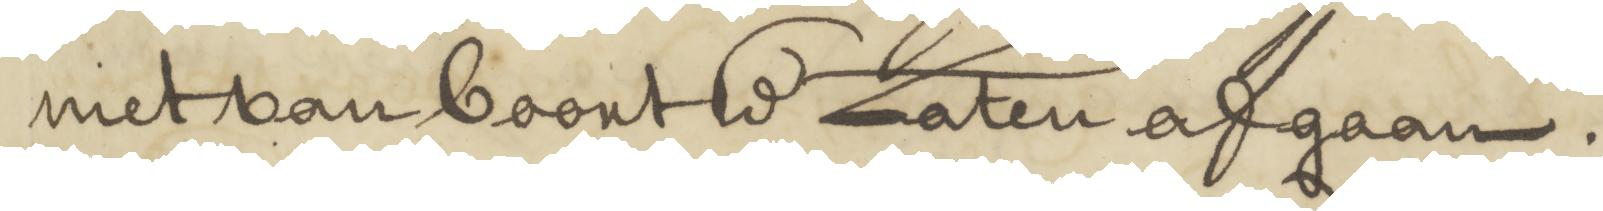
niet van boort te Laten afgaan.
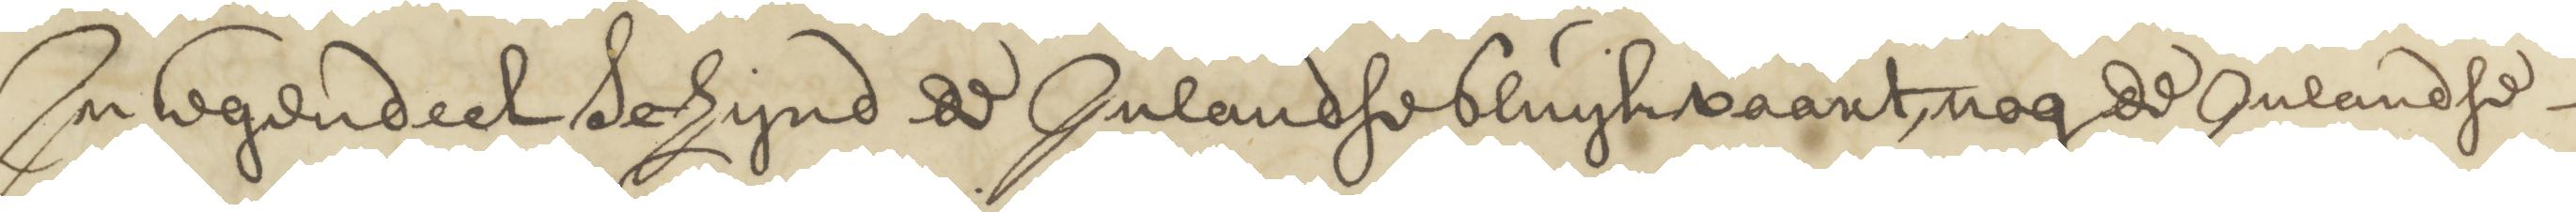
In tegendeel schijnd de Jnlandse sluijkvaart, nog de Jnlandse
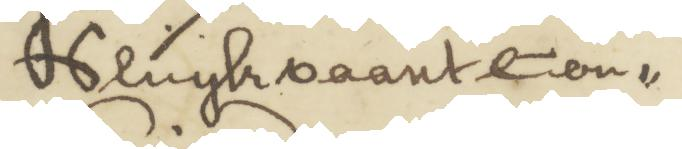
sluijkvaart Con„
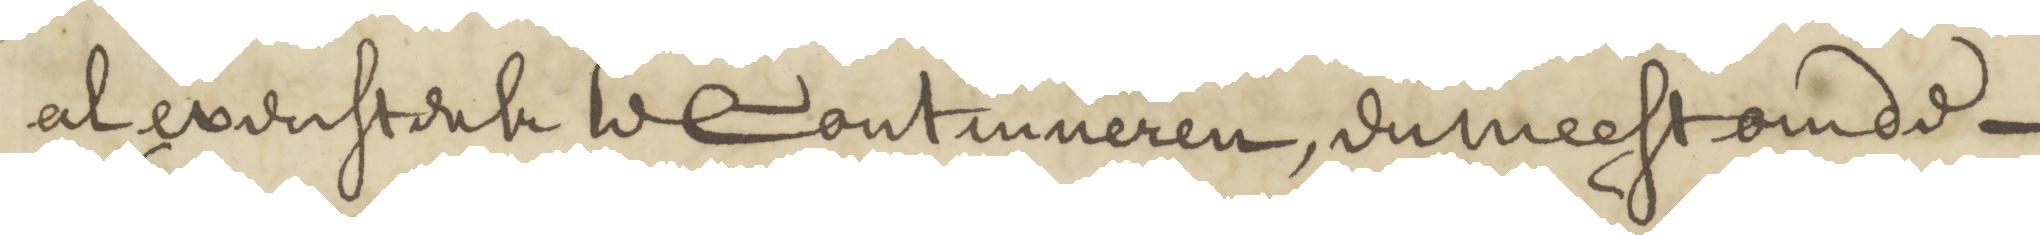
al even sterk te Continueren, en meest om de
